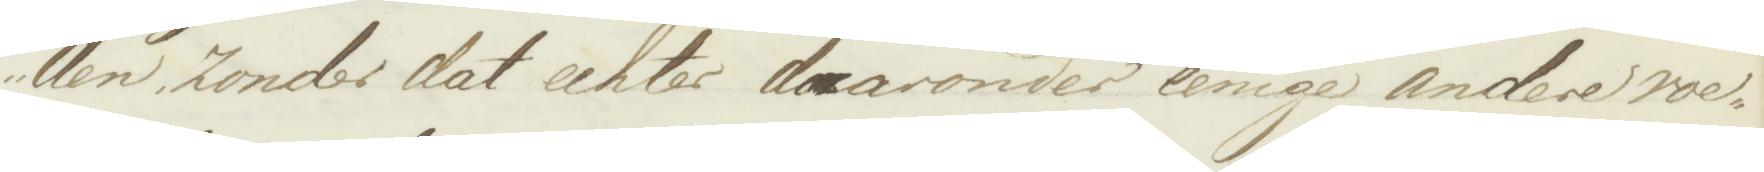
„den, zonder dat echter daaronder eenige andere roe„
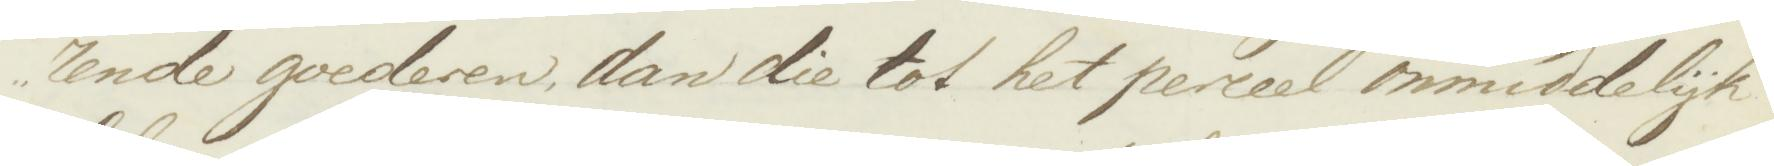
„rende goederen, dan die tot het perceel onmiddelijk
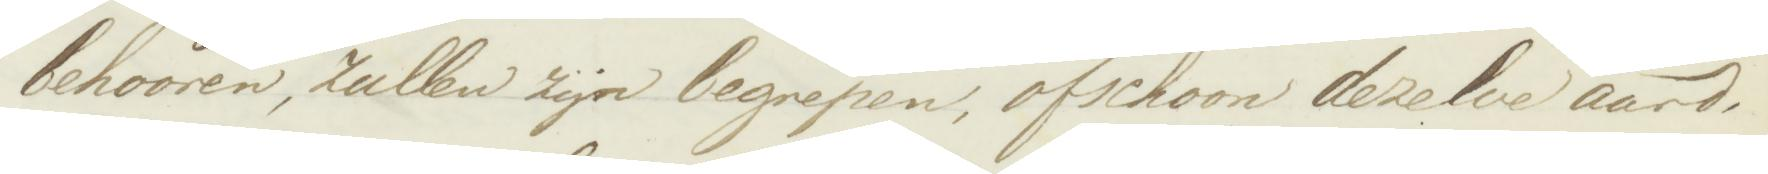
behooren, zullen zijn begrepen, ofschoon dezelve aard.
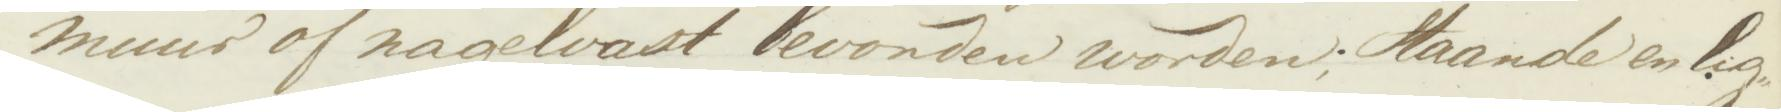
muur of nagelvast bevonden worden; staande en lig„
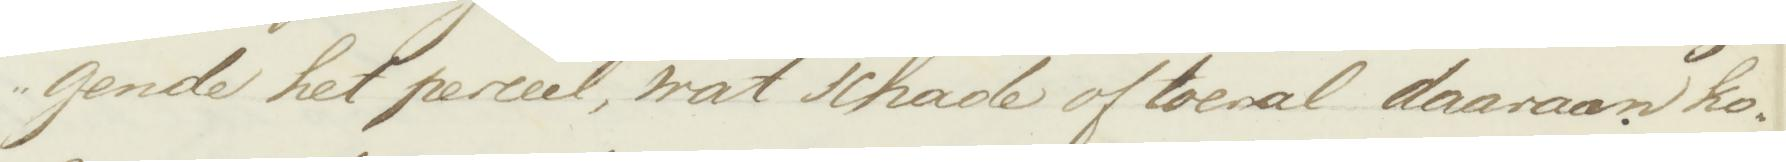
„gende het perceel, wat schade of toeval daaraan ko„
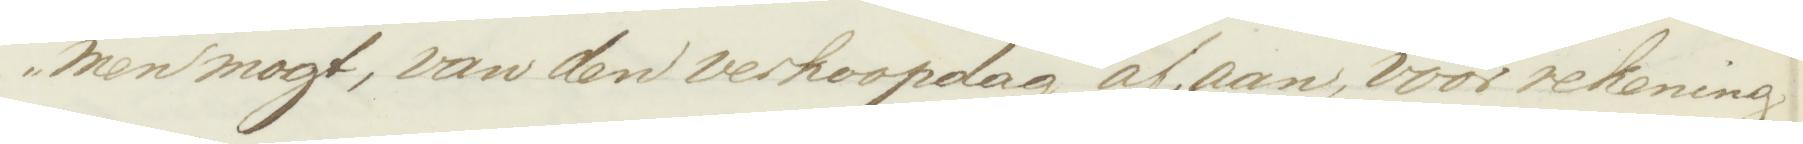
„men mogt, van den verkoopdag af, aan, voor rekening
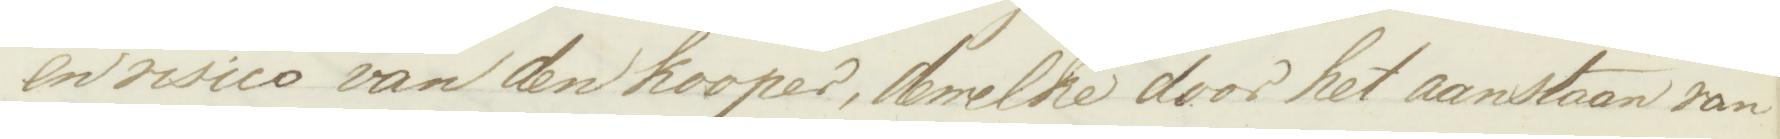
en risico van den kooper, dewelke door het aanstaan van
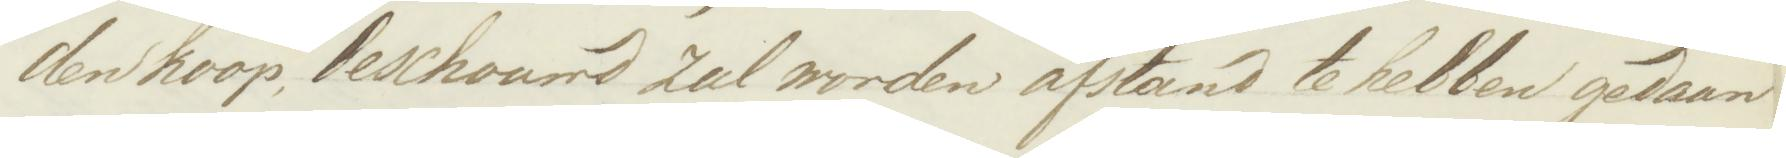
den koop, beschouwd zal worden afstand te hebben gedaan
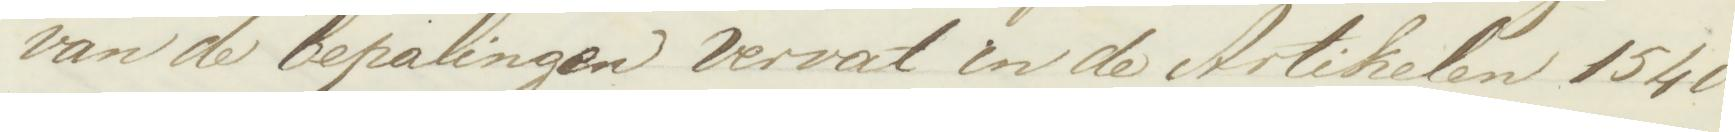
van de bepalingen vervat in de Artikelen 1540
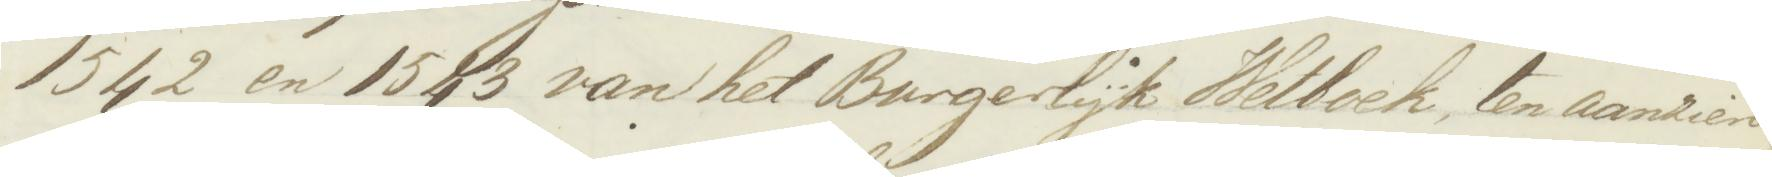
1542 en 1543 van het Burgerlijk Wetboek, ten aanzien
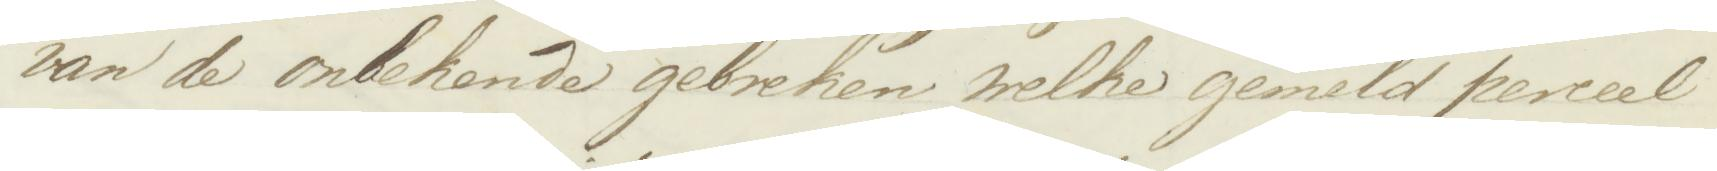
van de onbekende gebreken welke gemeld perceel
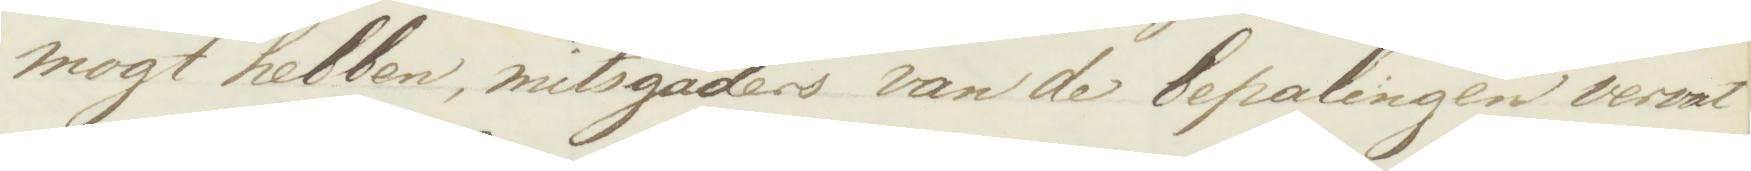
mogt hebben, mitsgaders van de bepalingen vervat
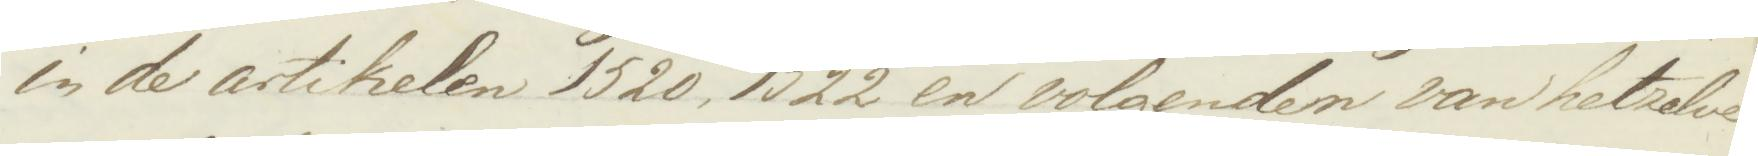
in de artikelen 1520, 1522 en volgenden van hetzelve
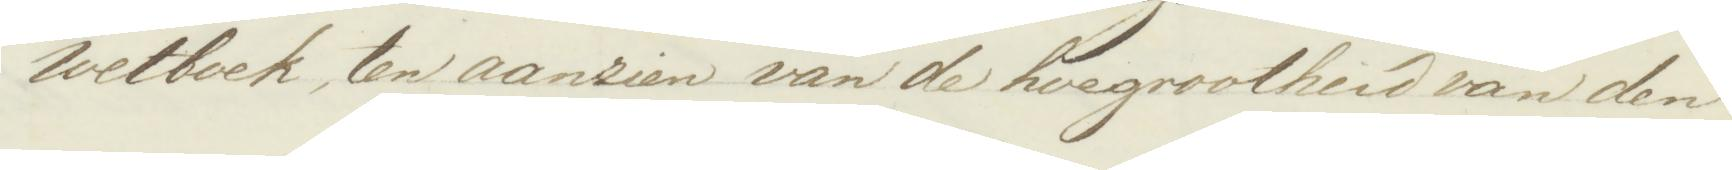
wetboek, ten aanzien van de hoegrootheid van den
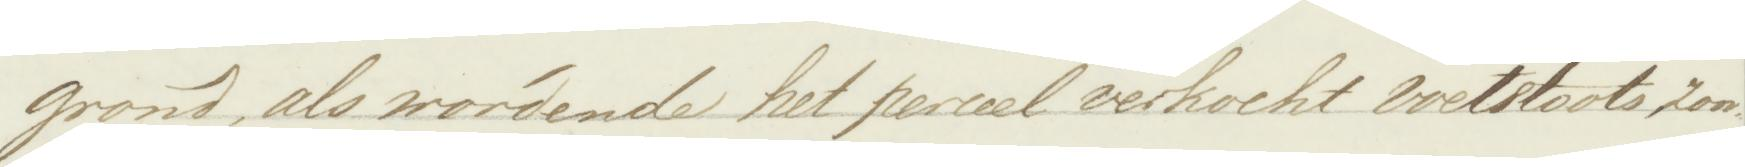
grond, als wordende het perceel verkocht voetstoots zon„
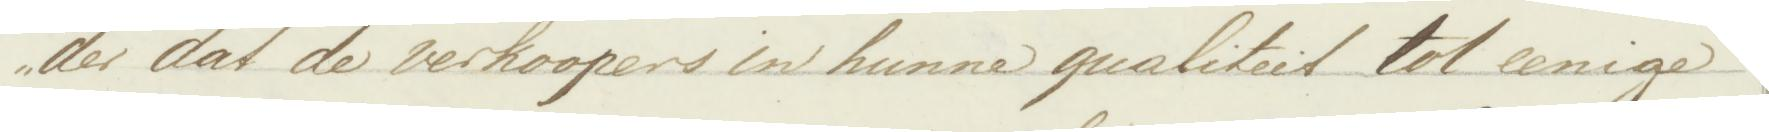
„der dat de verkoopers in hunne qualiteit tot eenige
